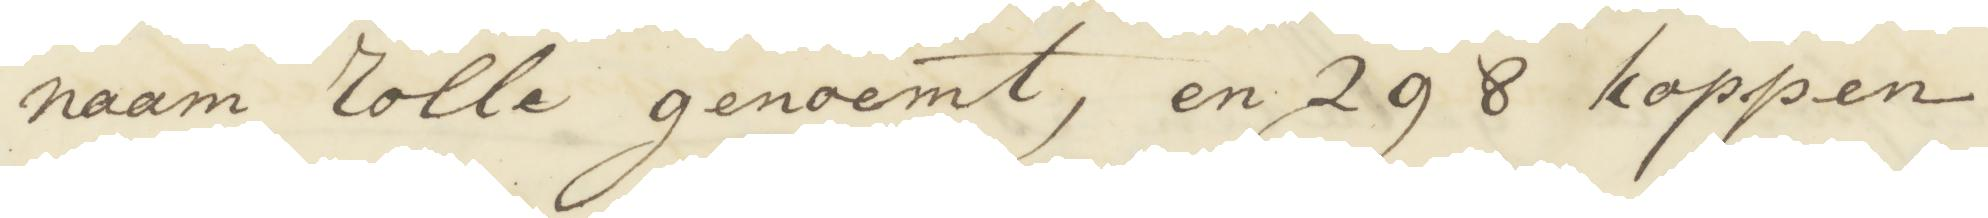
naam rolle genoemt, en 298 koppen
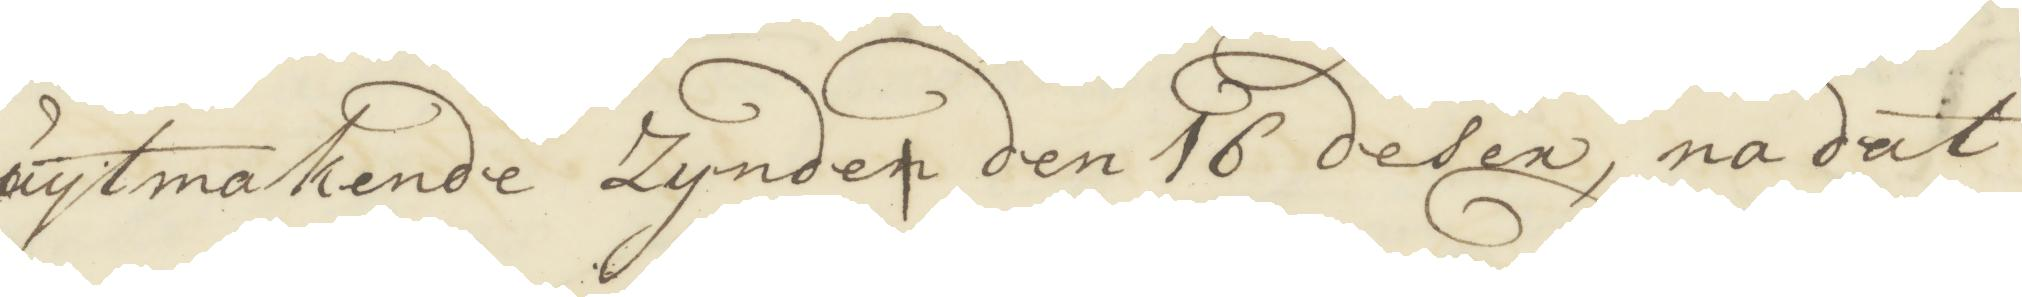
uijtmakende zynden den 16 deser, na dat
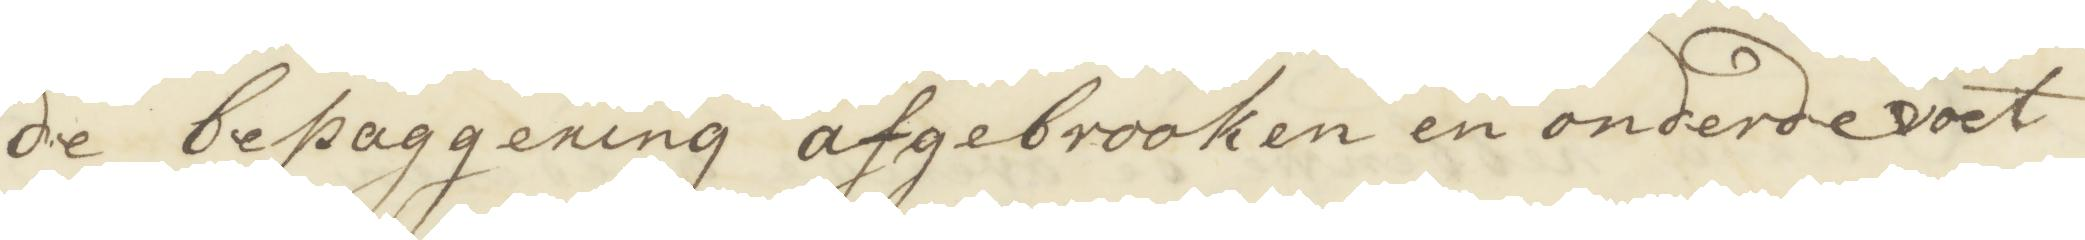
de bepaggering afgebrooken en onderde voet
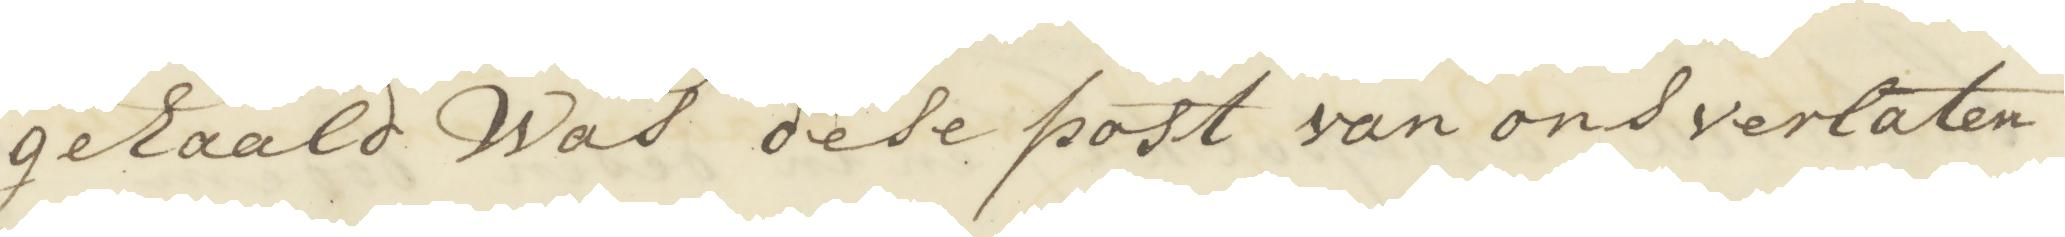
gehaald was dese post van ons verlaten
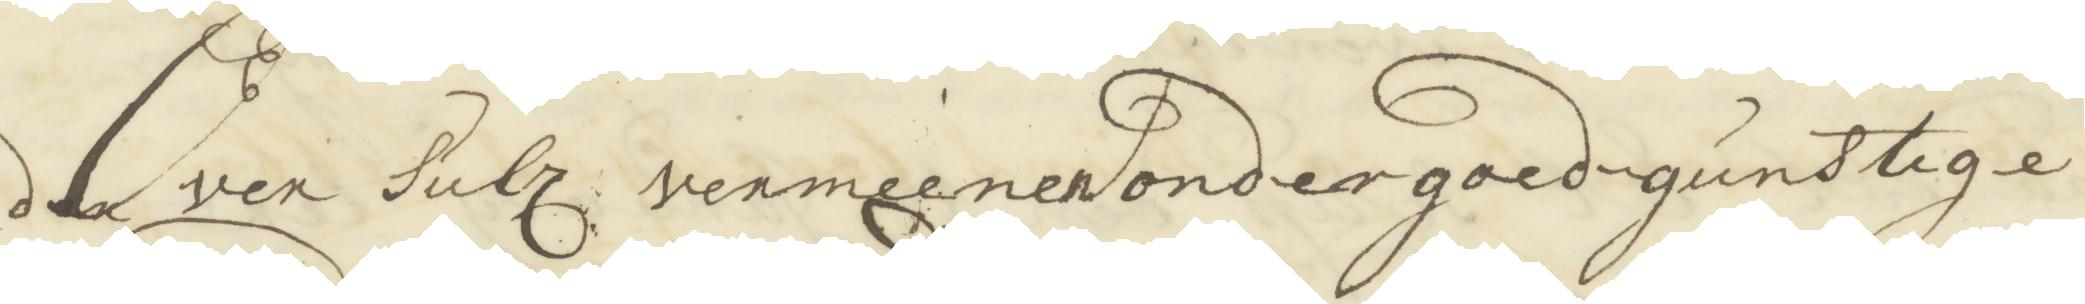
den Over sulx vermeenen onder goed-gunstige
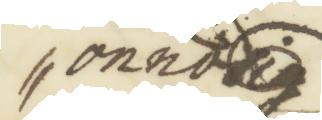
„onnodig
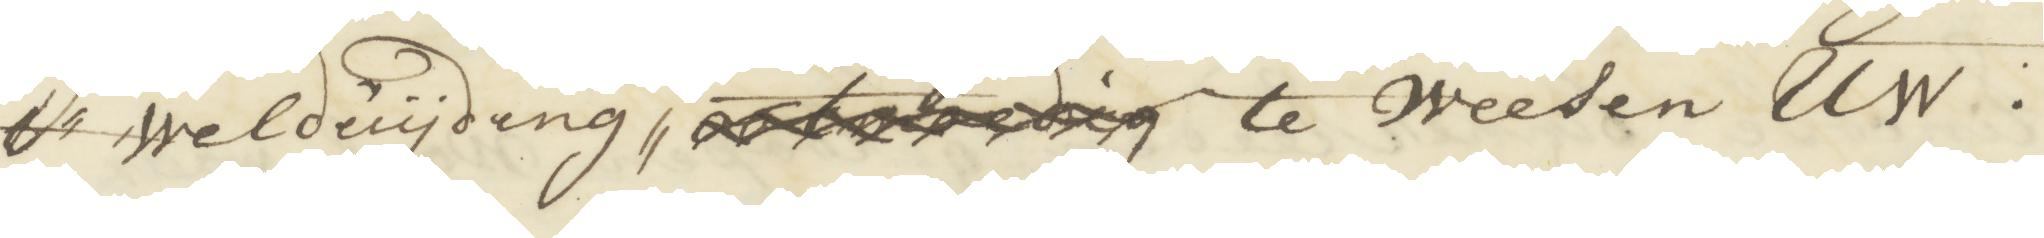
t' welduijding „onnodig te weesen UW:
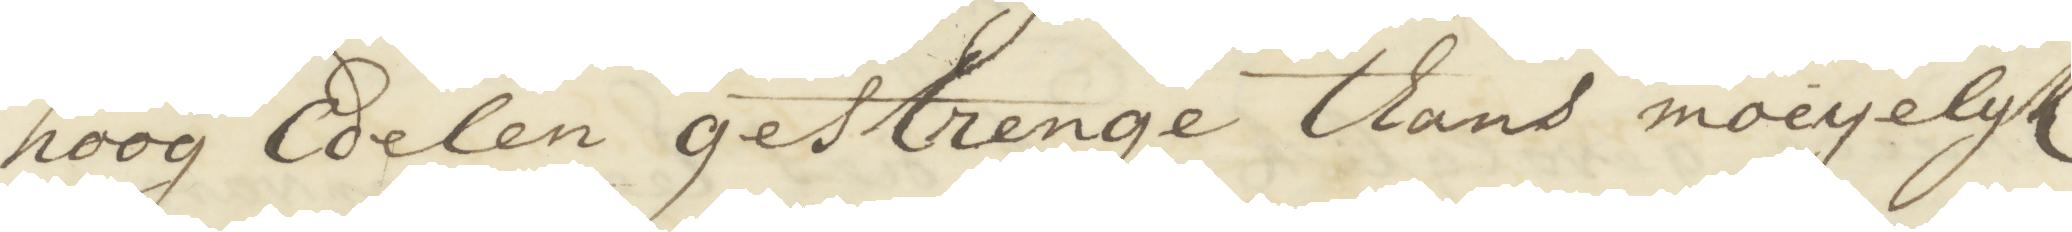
hoog Edelen gestrenge thans moeyelyk
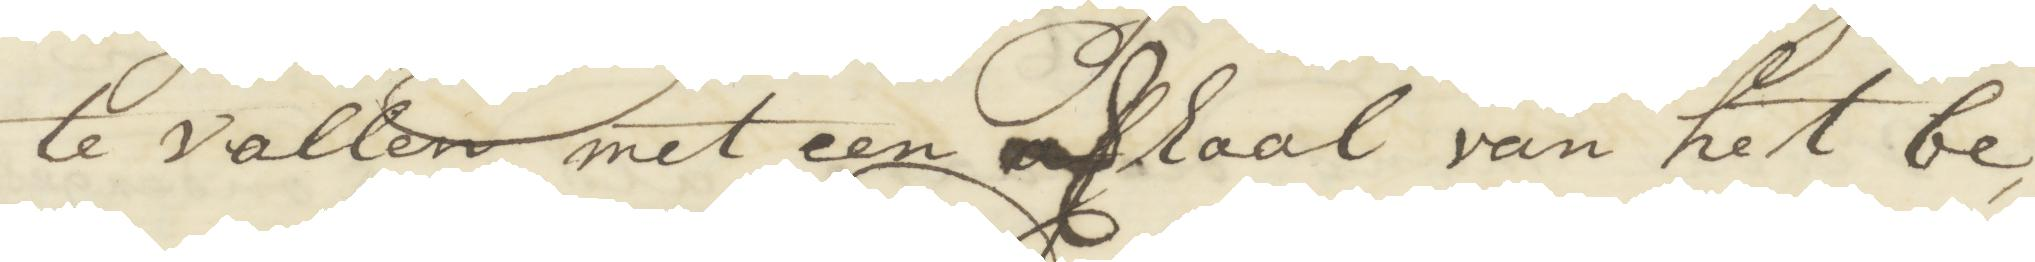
te vallen met een verhaal van het be„
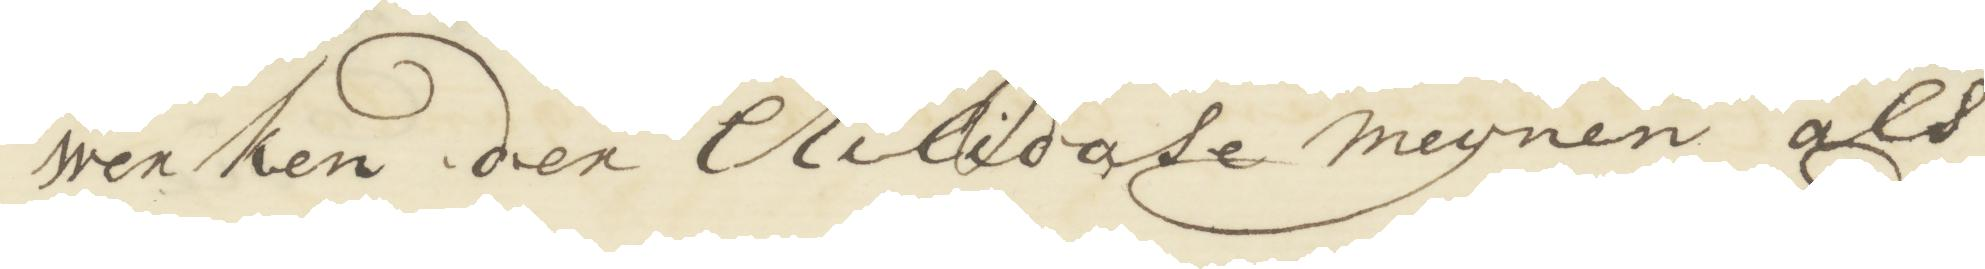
werken der Chilidase meynen als
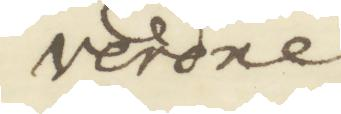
verdre
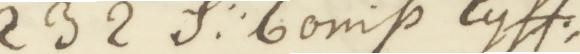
232 's: Comp lyff„
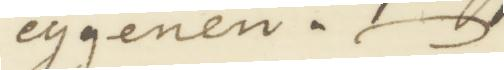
eygenen.
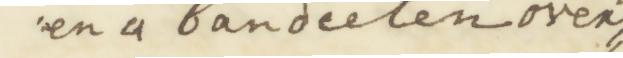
en 4 bandieten over
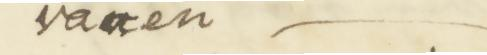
varen
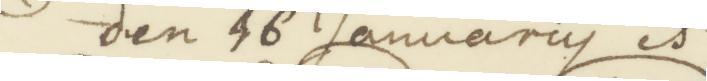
den 16 Januarij is
